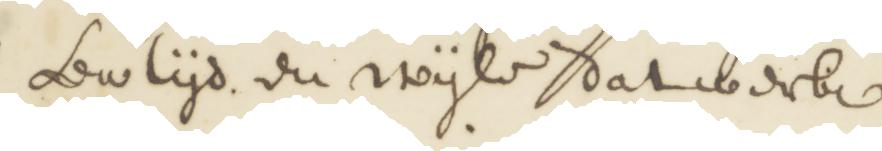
ten tijd en wijle dat werk
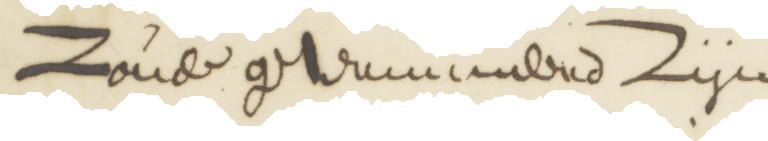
Zoude getermineerd Zijn
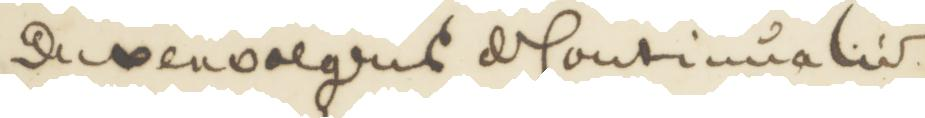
En vervolgens de Continuatie
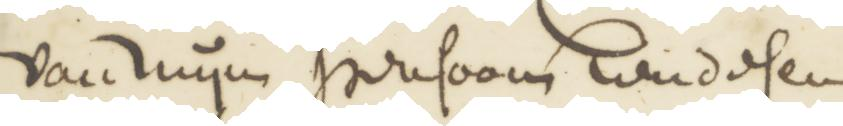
van mijn persoon ten desen
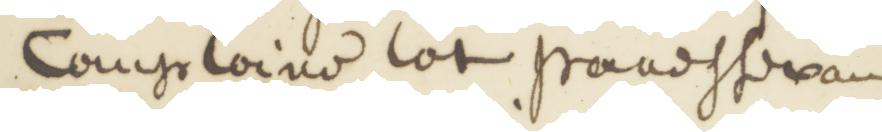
Comptoire tot paresse van
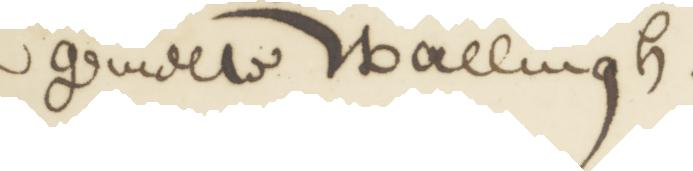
gemelte Wallingh.
